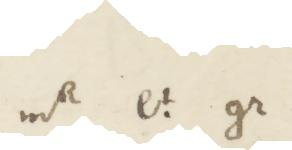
mk l.t gr
